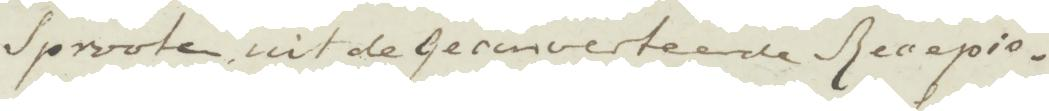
sprooten, uit de geconverteerde Recepis„
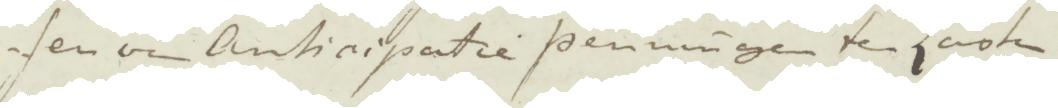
-sen van anticipatie penningen ten lasten
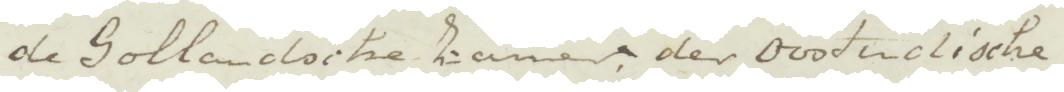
de Hollandsche Kamer, der Oostindische
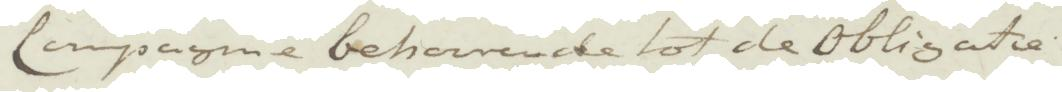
Compagnie behoorende tot de Obligatie
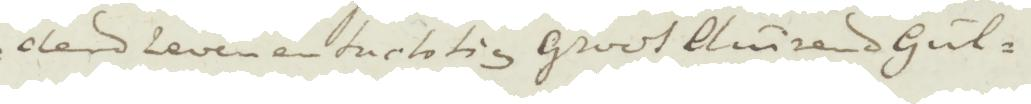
=derd zeven en tachtig Groot duizend Gul=
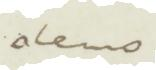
=dens
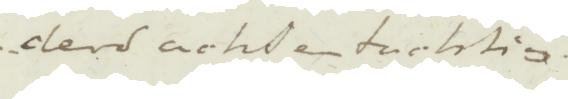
„derd acht en tachtig.
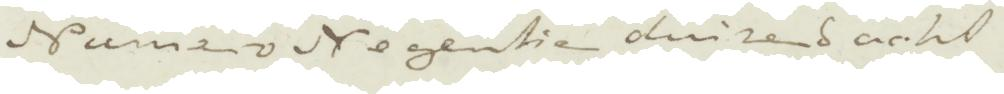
Numero Negentien duizend acht
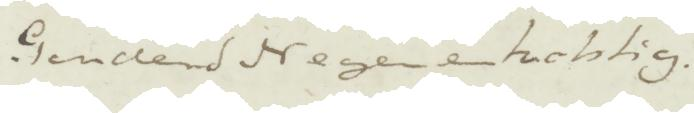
honderd Negen en tachtig.
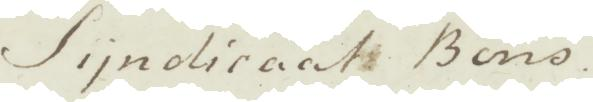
Sijndicaat Bons.
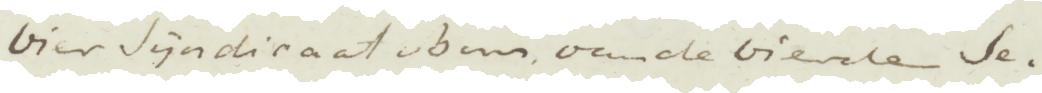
vier sijndicaat-bons, van de vierden se„
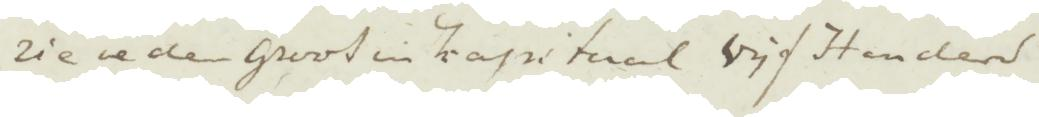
rie ieder groot in kapitaal vijf Honderd
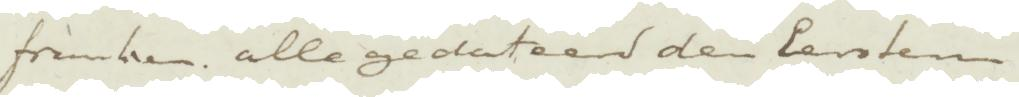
franken. alle gedateerd den Eersten
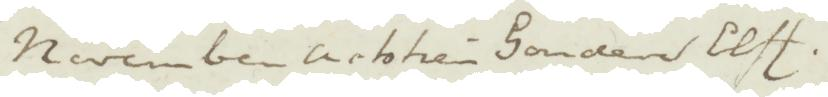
November achtien honderd Elff.
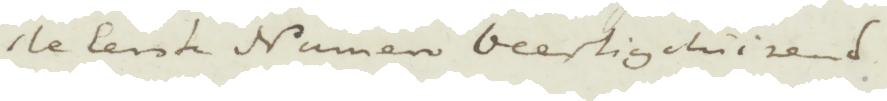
de Eerste Numero veertig duizend.
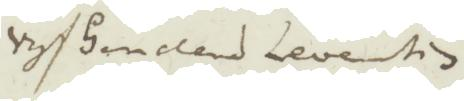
vyf honderd zeventig
